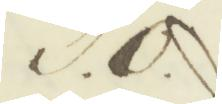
I.O.
